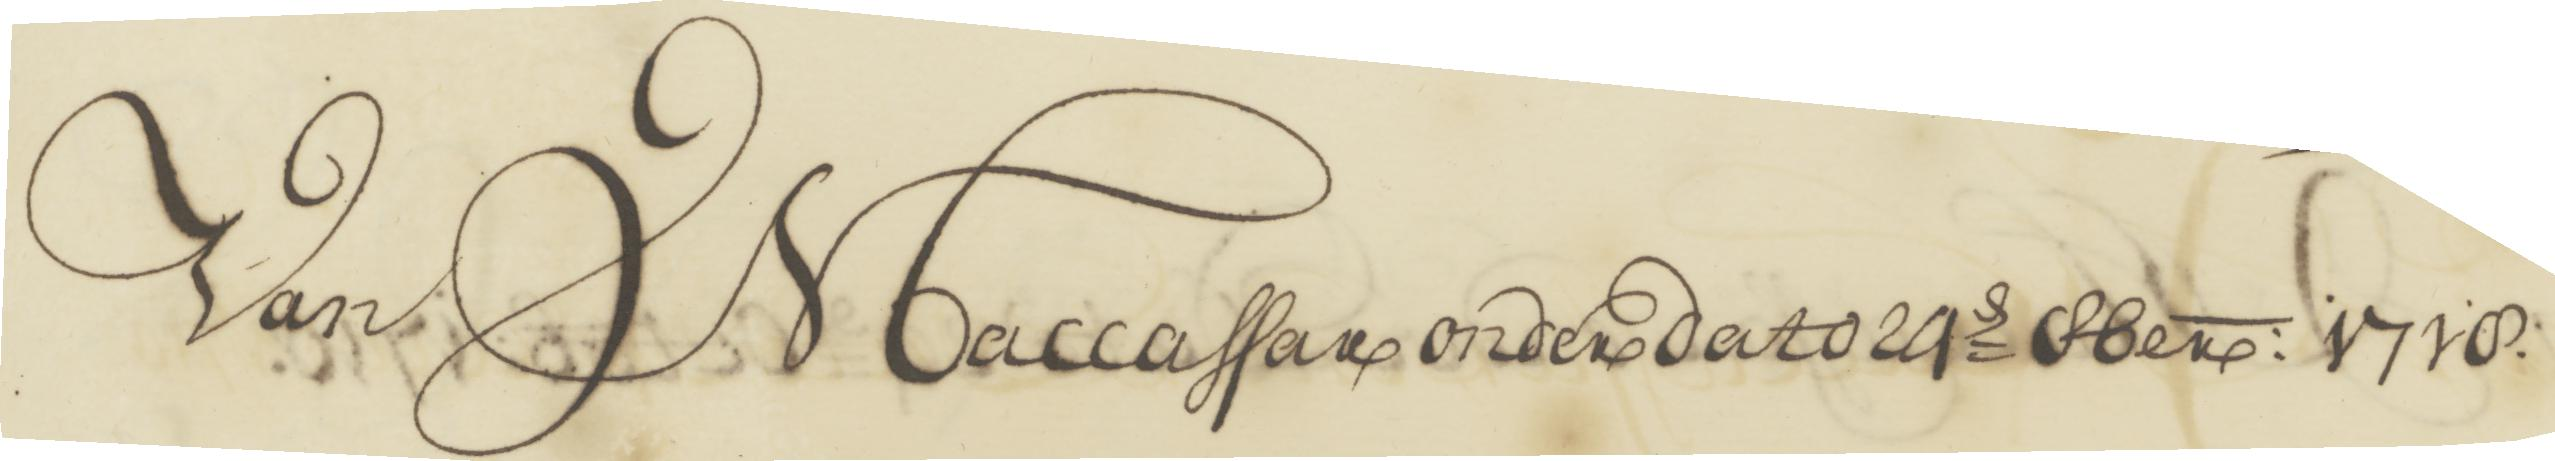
Van Maccassar onder dato 24:en 8ber: 1718:
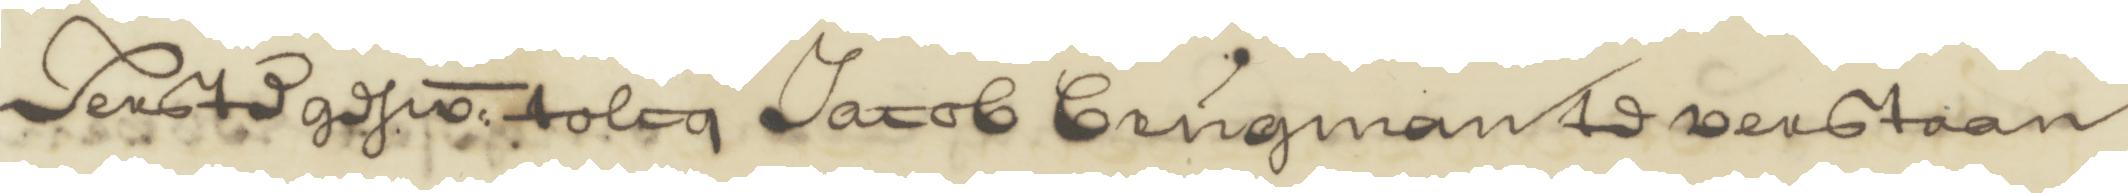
Eerste gesw: tolcq Iacob brugman te verstaan
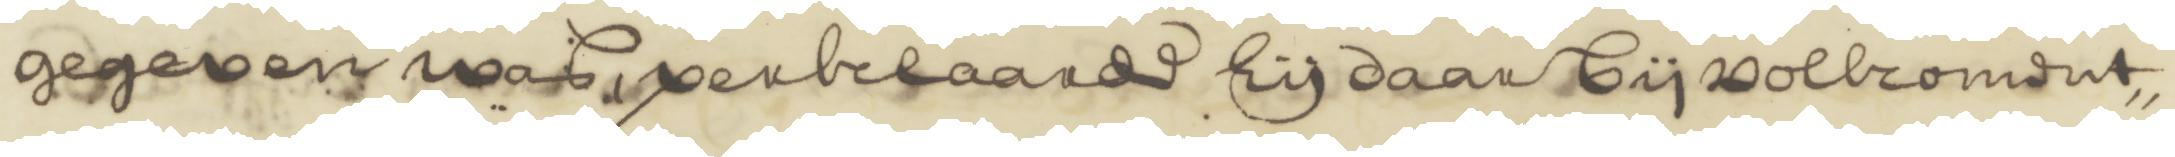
gegeven was, verklaarde hij daar bij volkoment„
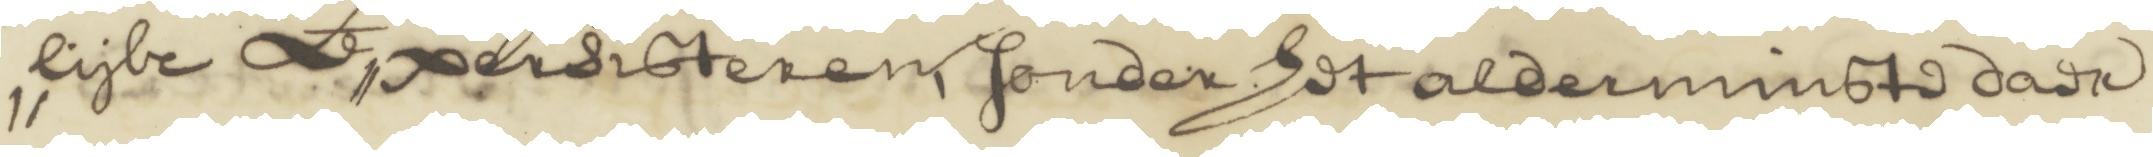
„lijk te „ persisteren, sonder het alderminste daer
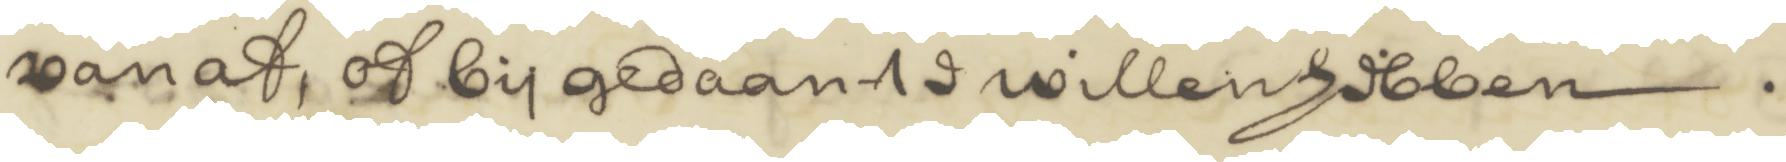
van af, of bij gedaan te willen hebben.
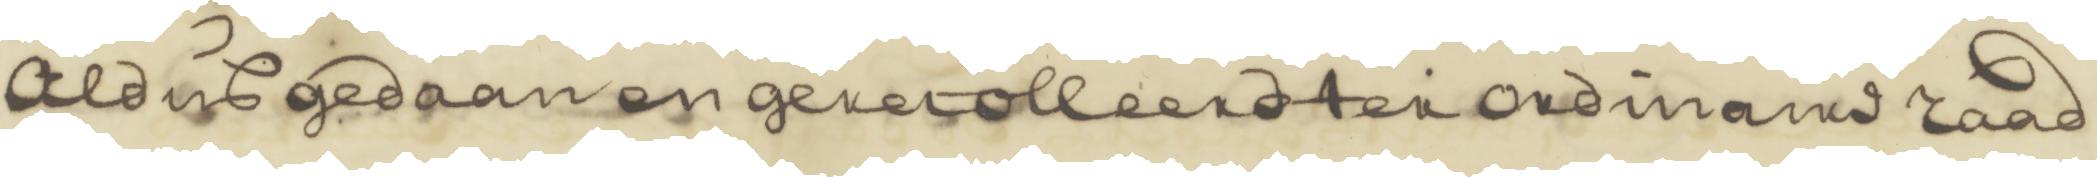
aldus gedaan en gerecolleerd ter ordinaire raad
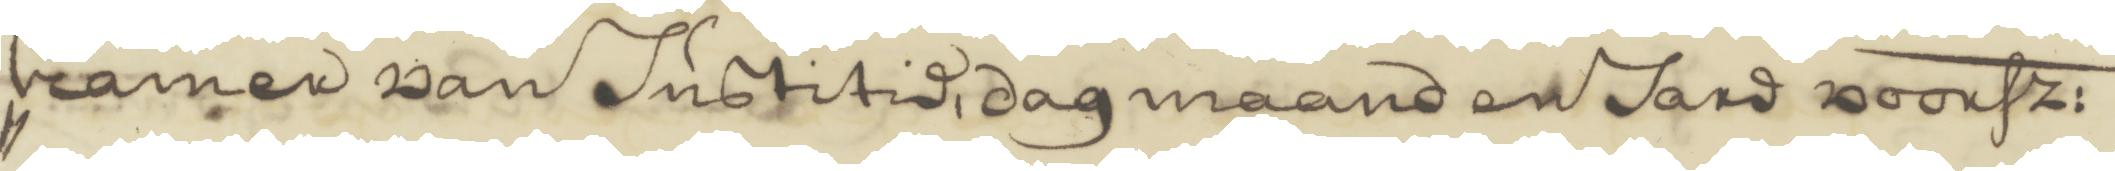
„kamer van Iustitie, dag maand en Iare voorsz:
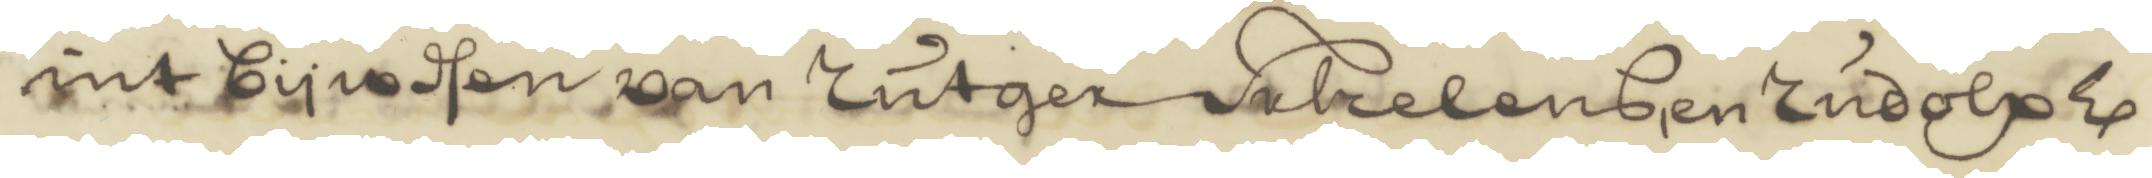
int bijwesen van rutger Erkelens, en rudolph
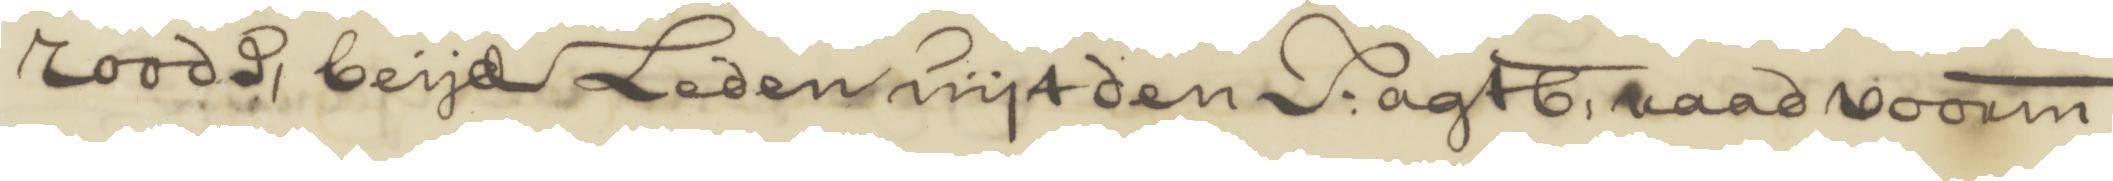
roode, beijde Leden uijt den E: agtb: raad voorm,
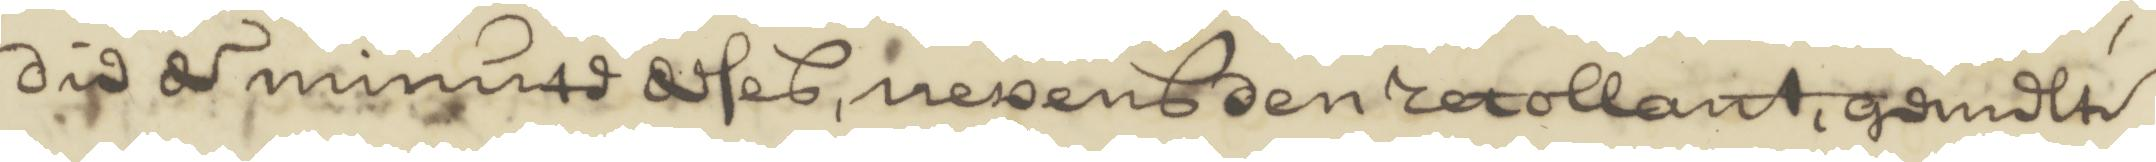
die de minute deses, nevens den recollant, gemelte
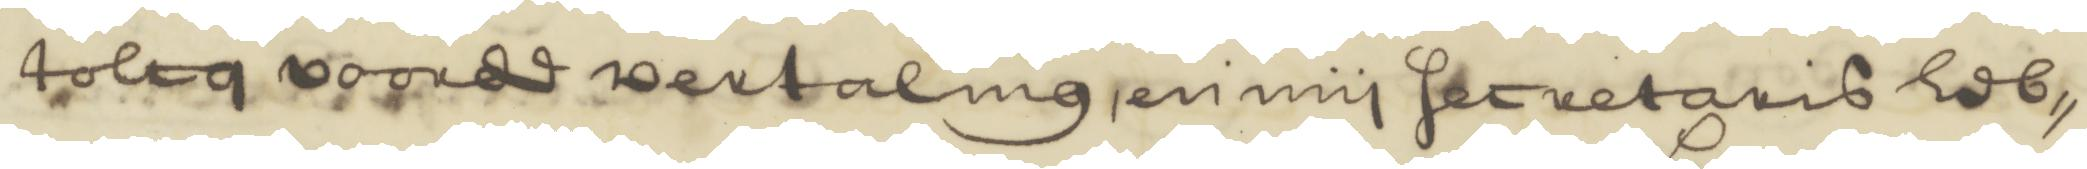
tolcq voorde vertaling, en mij secretaris heb„
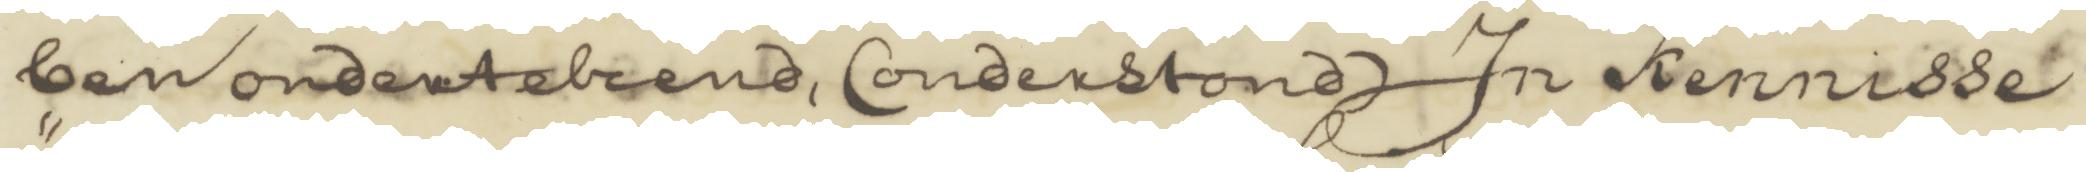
„ben ondertekend, (onderstond) Jn kennisse
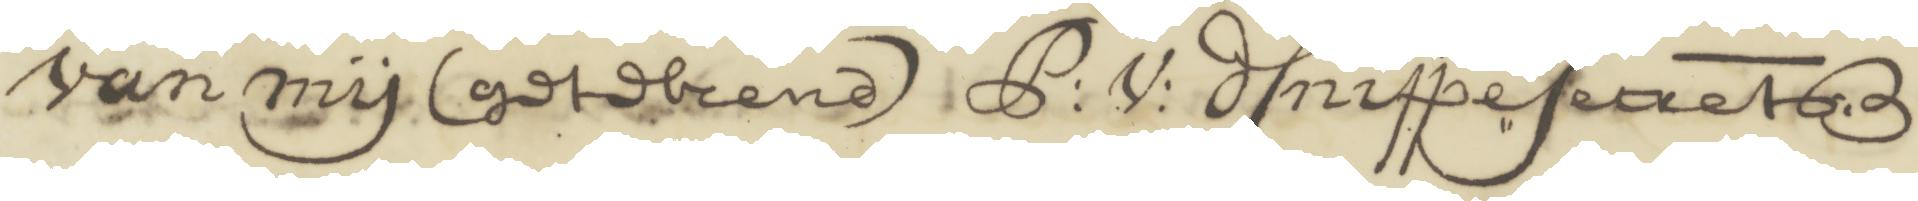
van mij (getekend) P: V: dSnippe„ secrets:
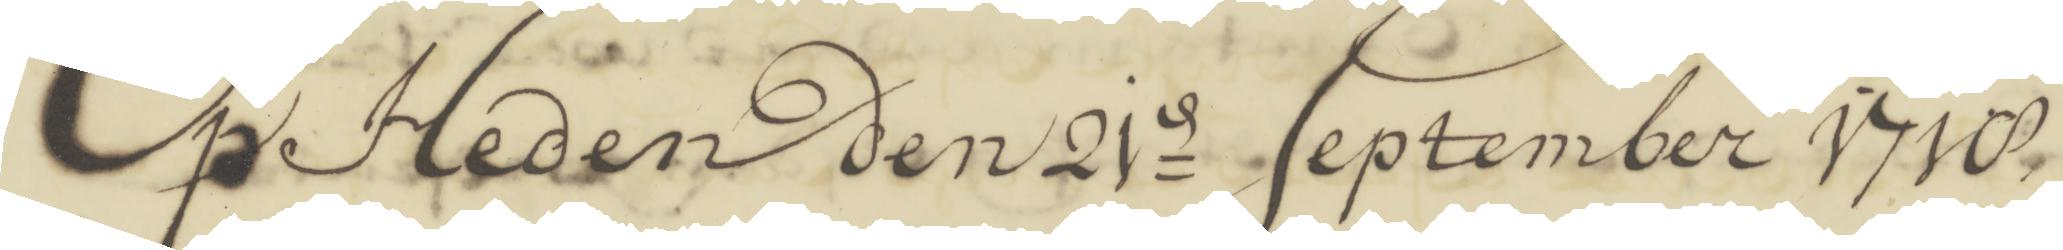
Op Heden den 21=en September 1718,
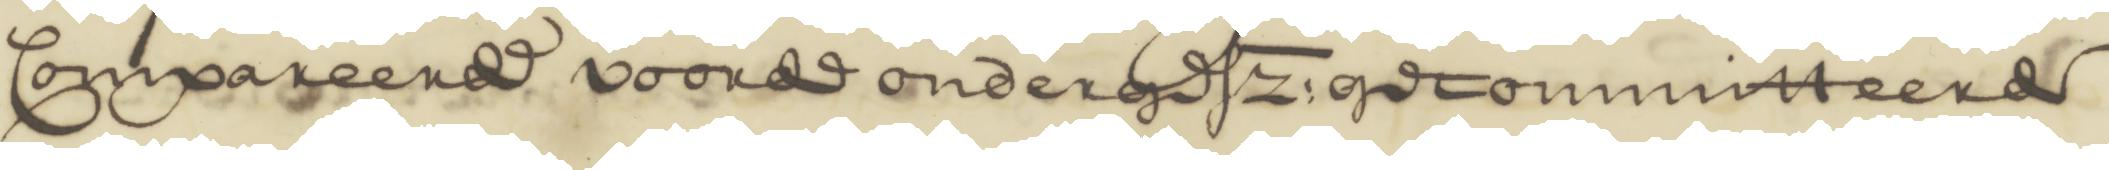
Compareerde voorde ondergesz: gecommitteerde
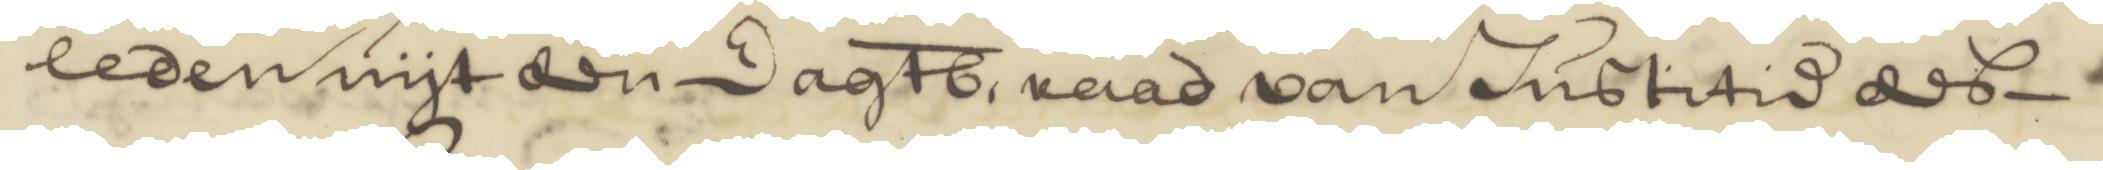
leden uijt den E agtb: raad van Iustitie des —
